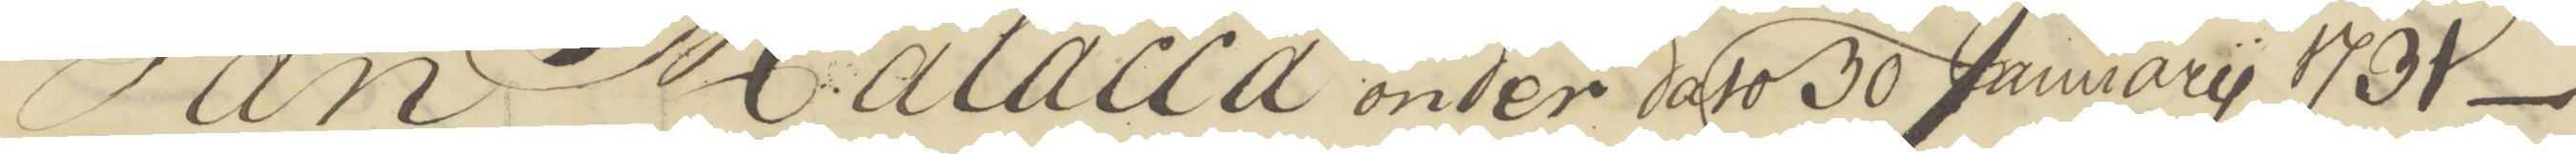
Van Malacca onder dato 30 Januarij 1731 —
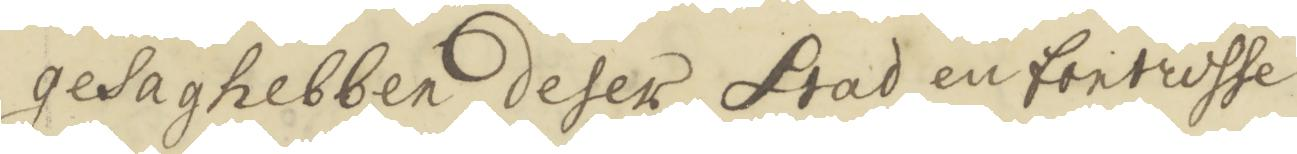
gesaghebber deser stad en fortresse
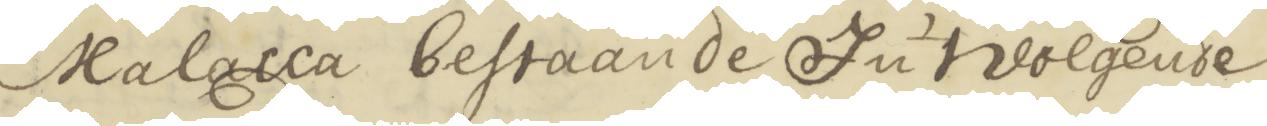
Malacca bestaande In 't volgende
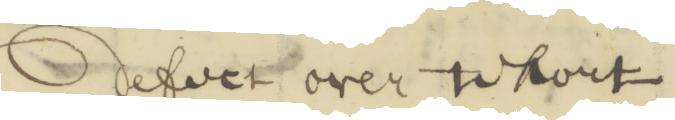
defect over tekort
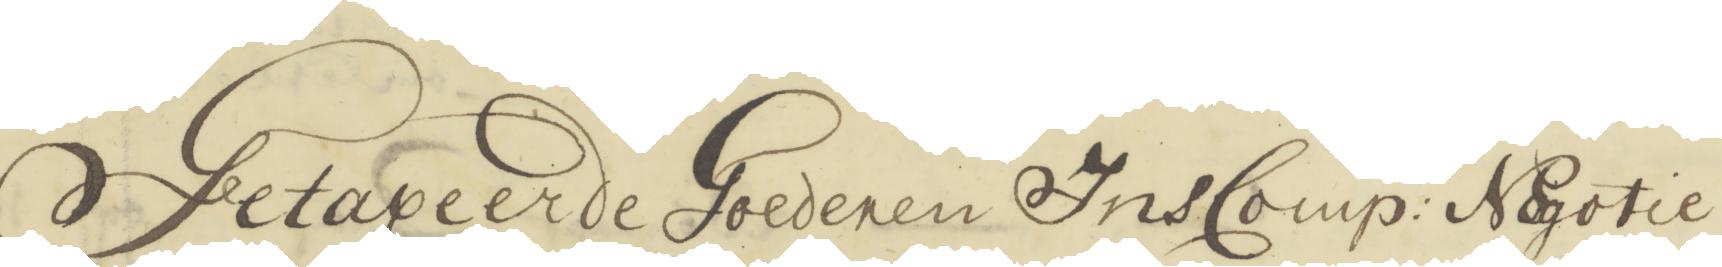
Getaxeerde Goederen InsComp:s Negotie
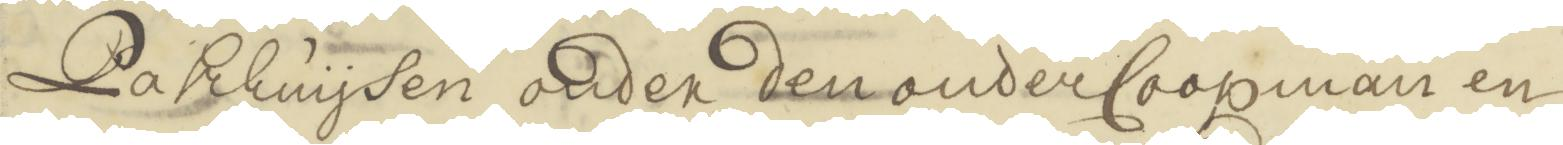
Pakhuijsen onder den onderCoopman en
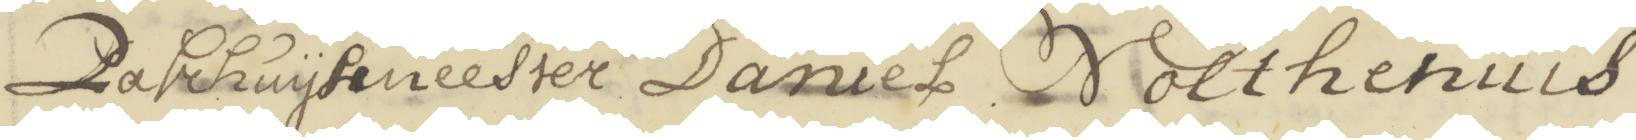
Pakhuijsmeester Daniel Nolthenius
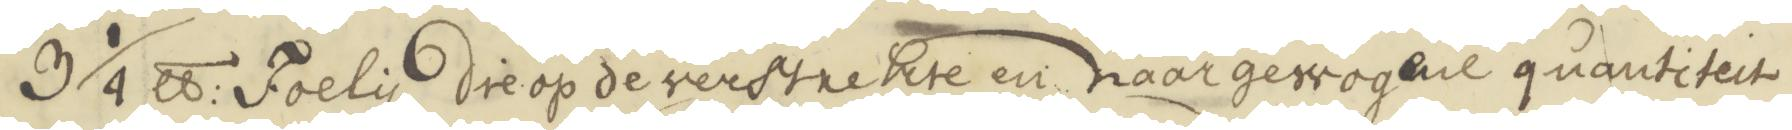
3¼ lb: Foelij die op de verstrekte en naar gewogene quantiteit
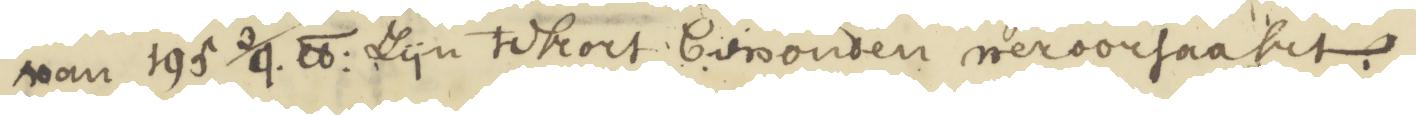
van 195¾. lb: Zijn tekort bevonden veroorsaakt
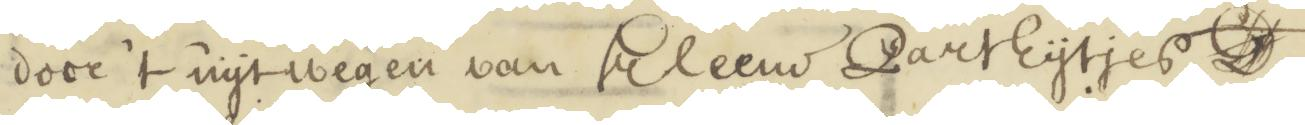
door ’t uijt wegen van kleene Parthijtjes D
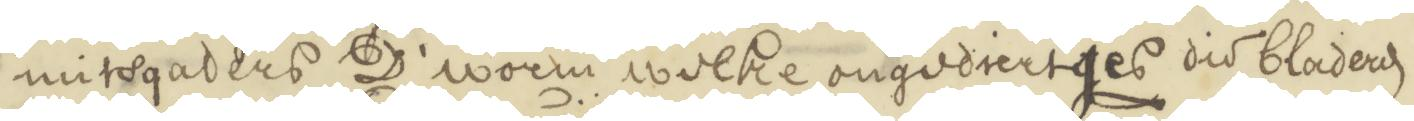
mitsgaders D' worm welke ongediertjes die bladeren
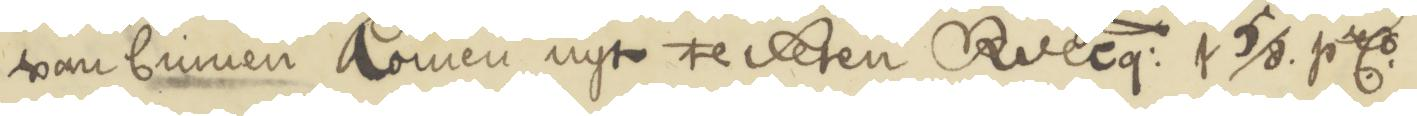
van binnen Comen uijt te Eten Reecq: 1 5/8. p:r C:o
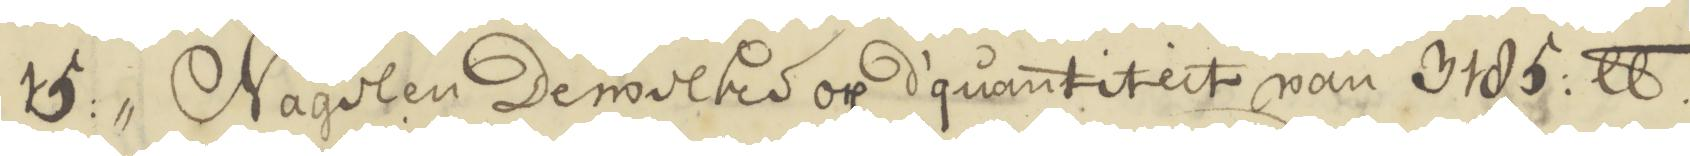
15: „ Nagelen Dewelke op d' quantiteit van 3185: lb:
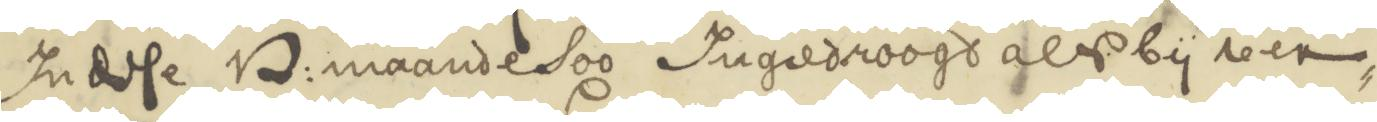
Jn dese V:' maande Soo Ingedroogd als bij ver„
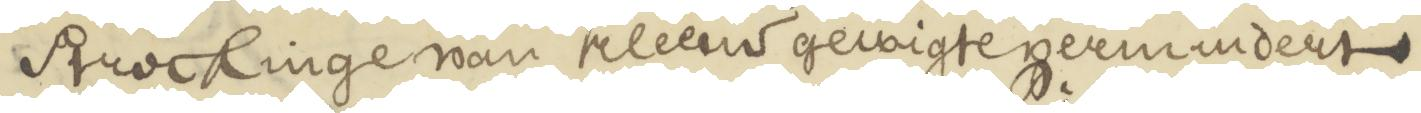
streckinge van kleene gewigte vermindert
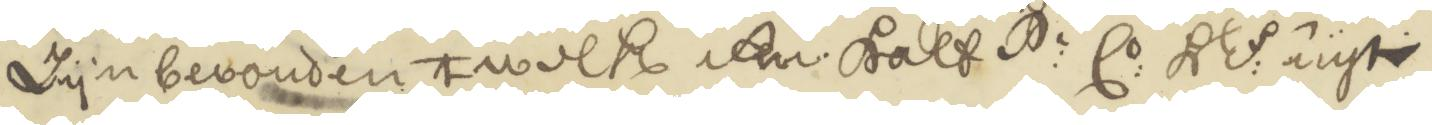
zijn bevonden twelk Een half P:r. C:o UE:s uijt
